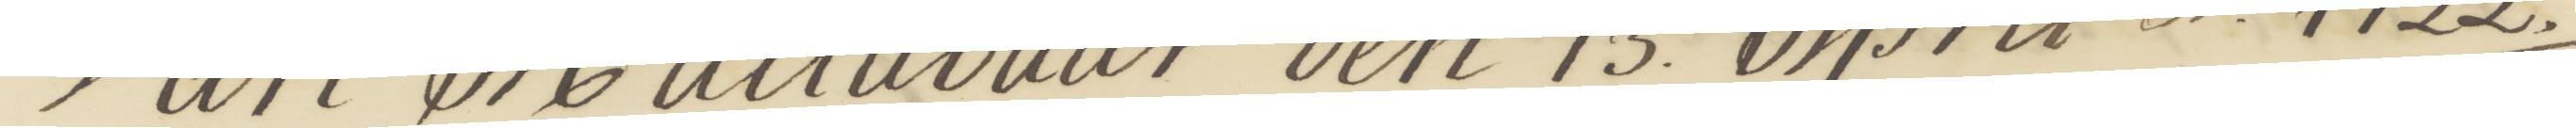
Van Mallabaar den 13:e April A:o 1722.
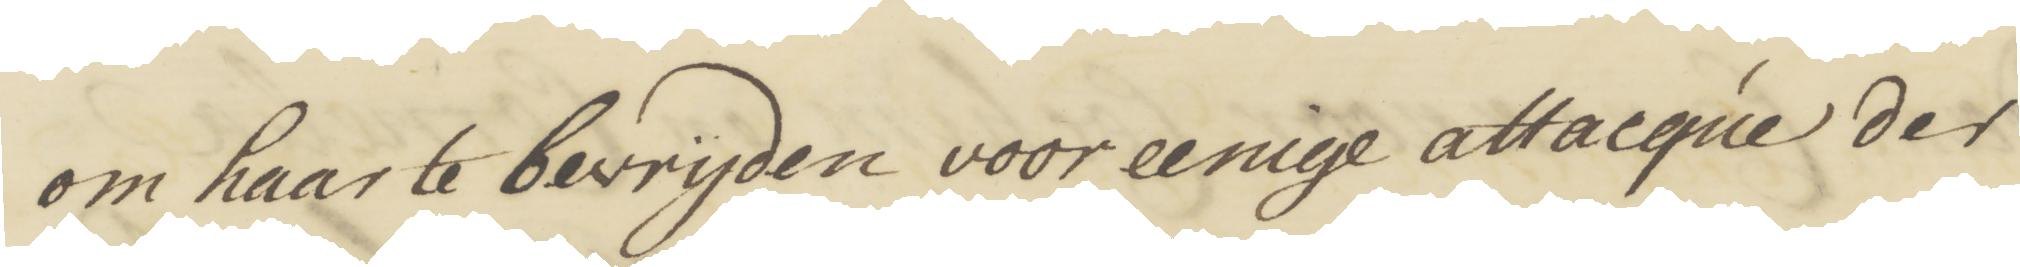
om haar te bevrijden voor eenige attacque der
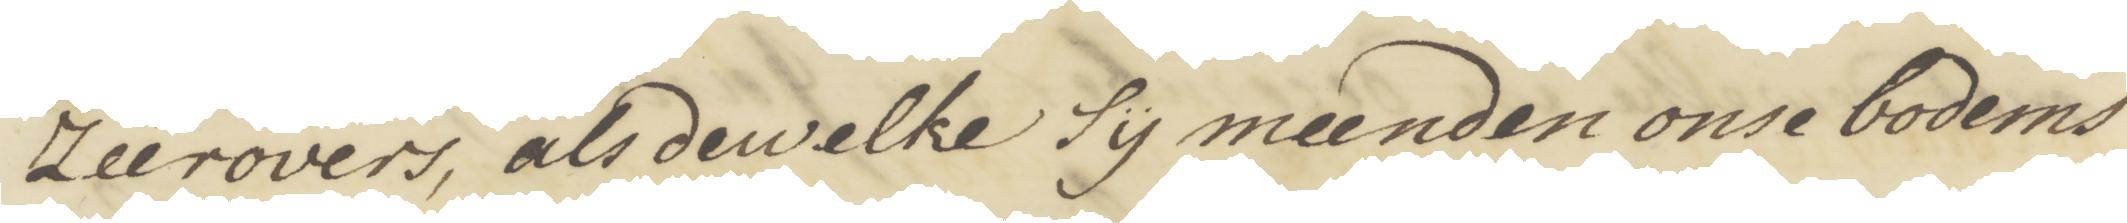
zeerovers, als dewelke sij meenden onse bodems
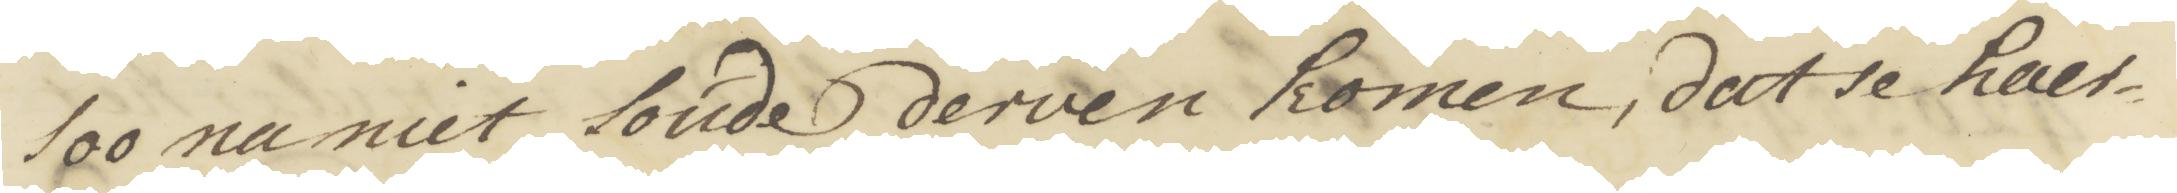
soo na niet soude derven komen, dat se haer=
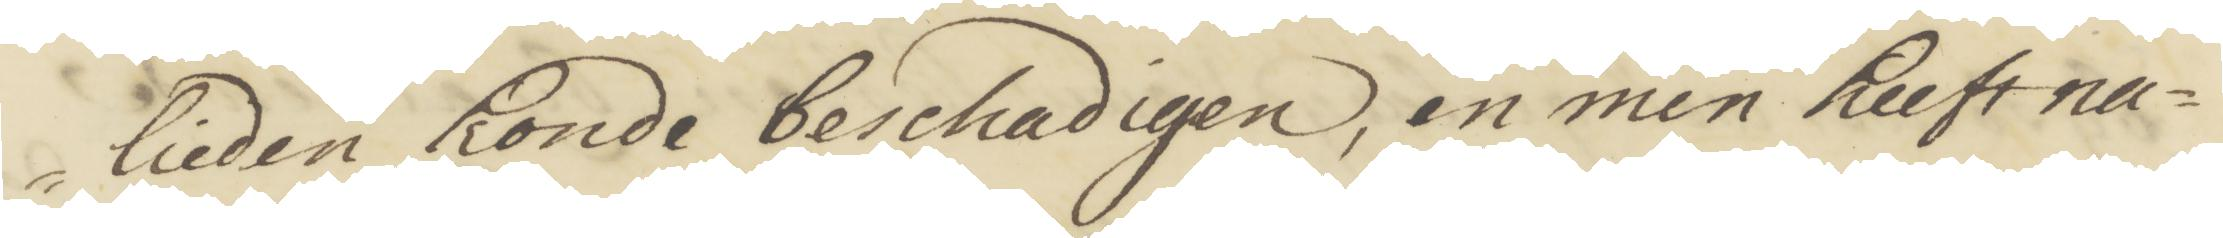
=lieden konde beschadigen, en men heeft na=
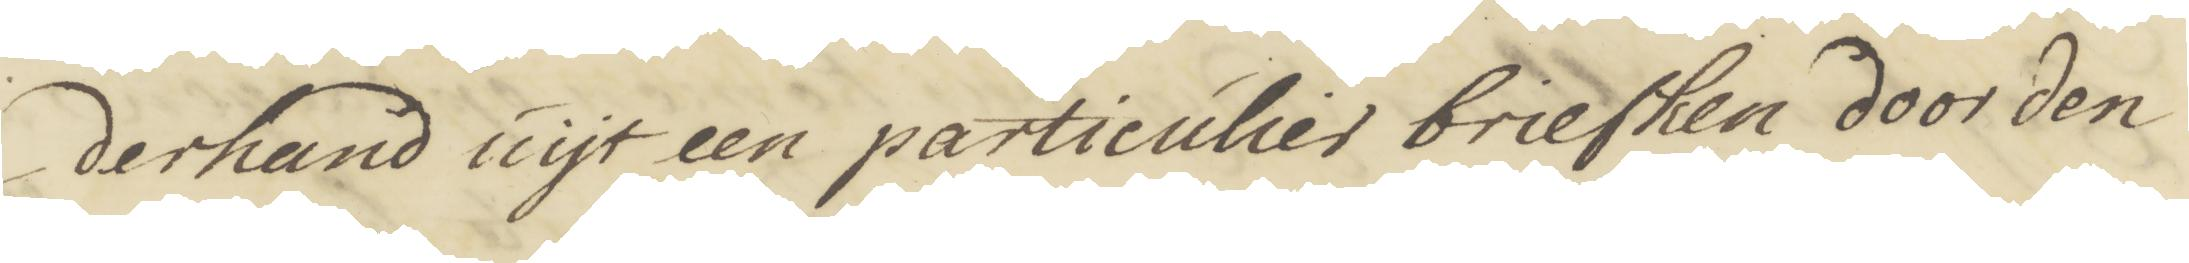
–derhand uijt een particulier briefken door den
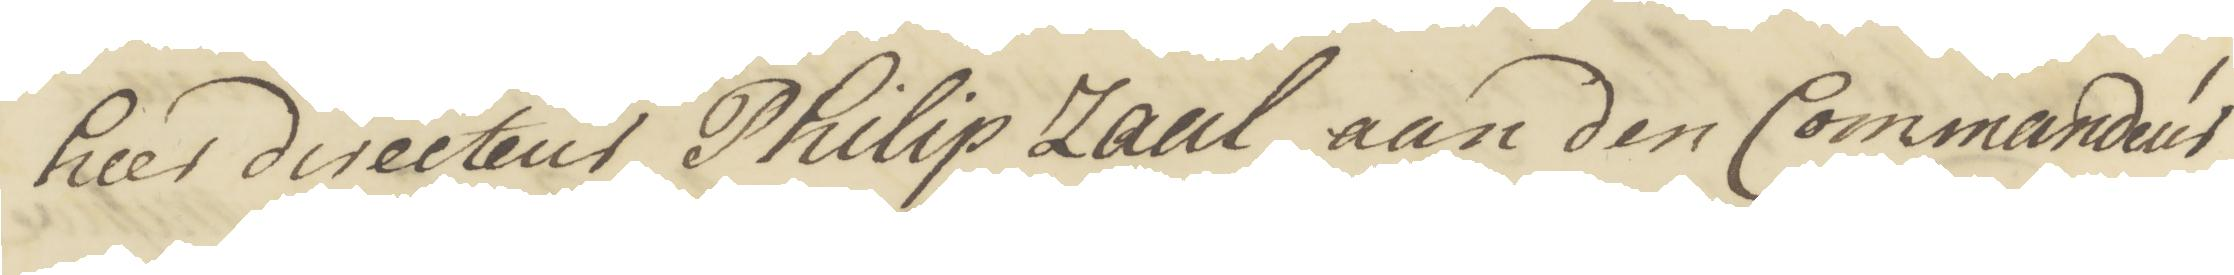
heer directeur Philip zaal aan den Commandeur
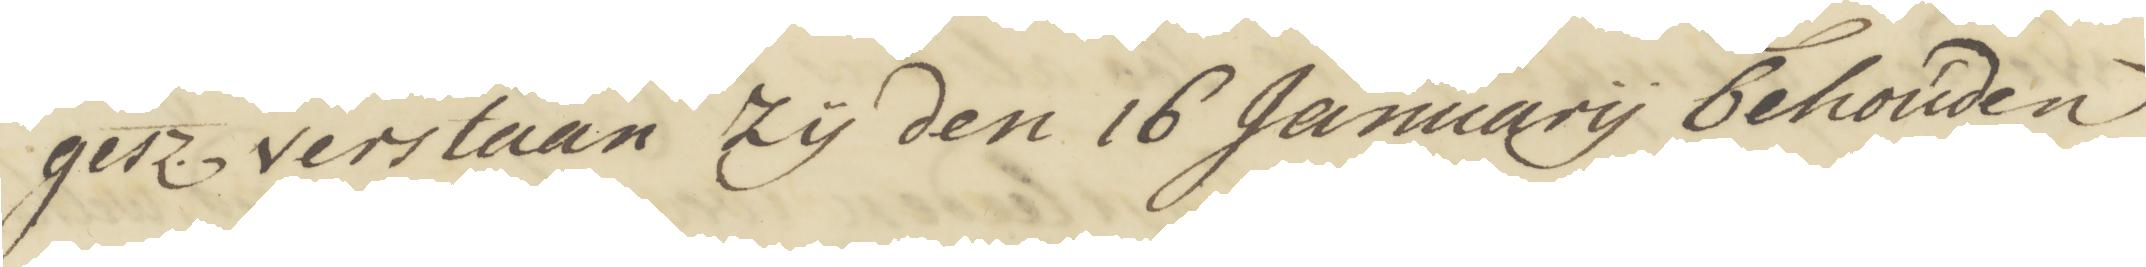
gesz. verstaan zij den 16 Januarij behouden
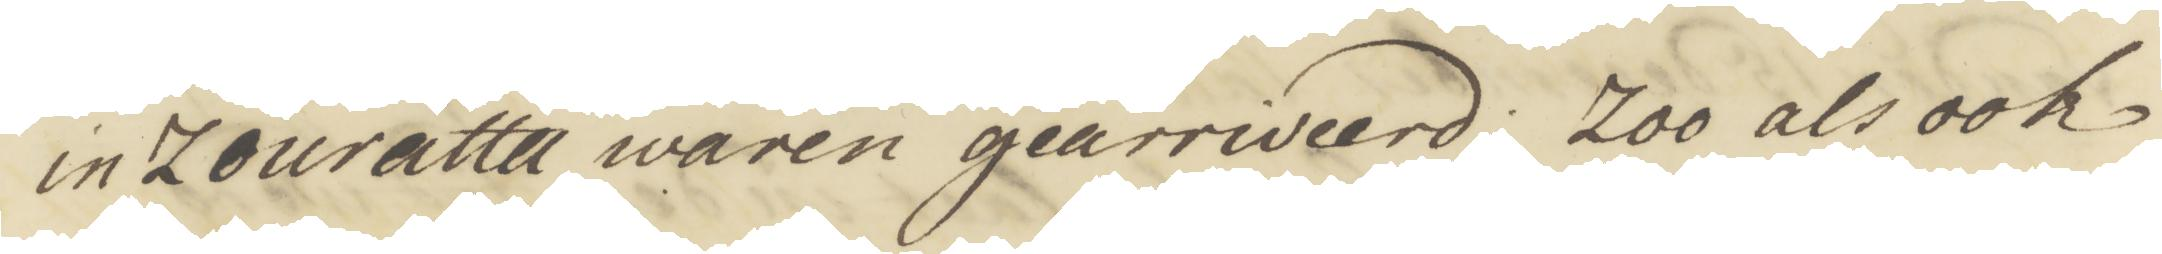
in zouratta waren gearriveerd; zoo als ook
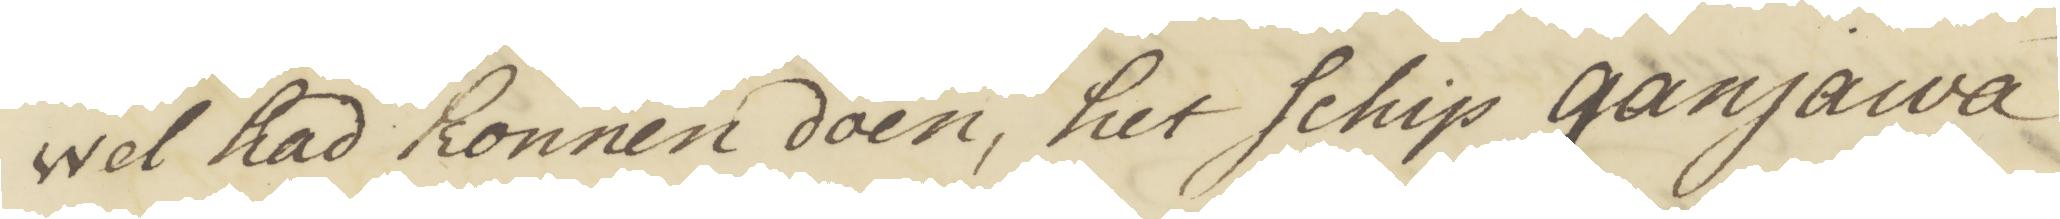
wel had konnen doen, het schip ganjawa
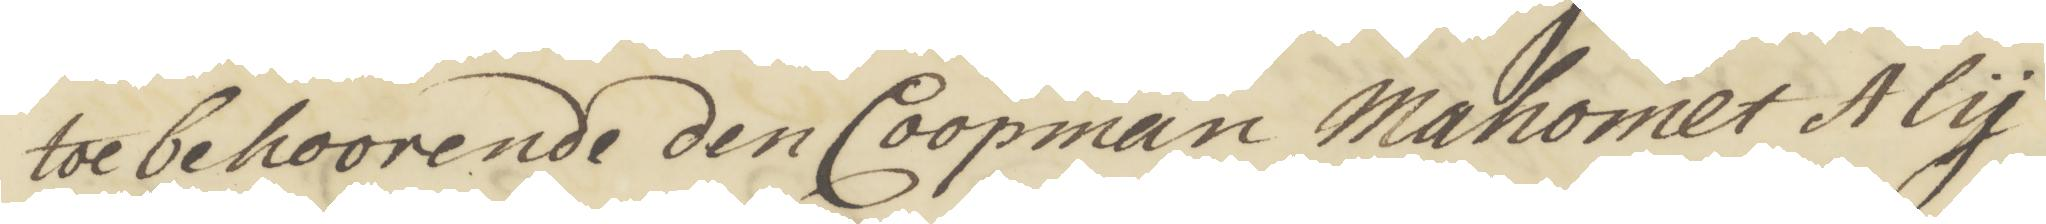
toe behoorende den Coopman Mahomet Alij
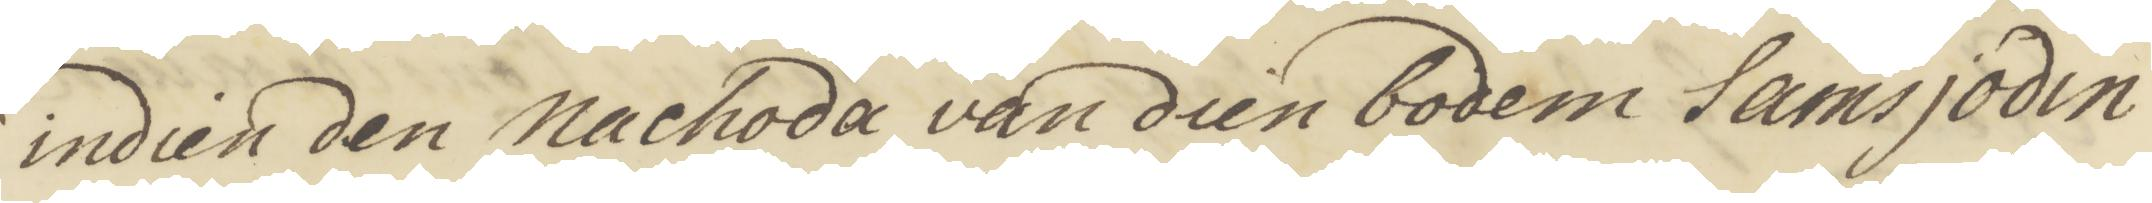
indien den nachoda van dien bodem Samsjodin
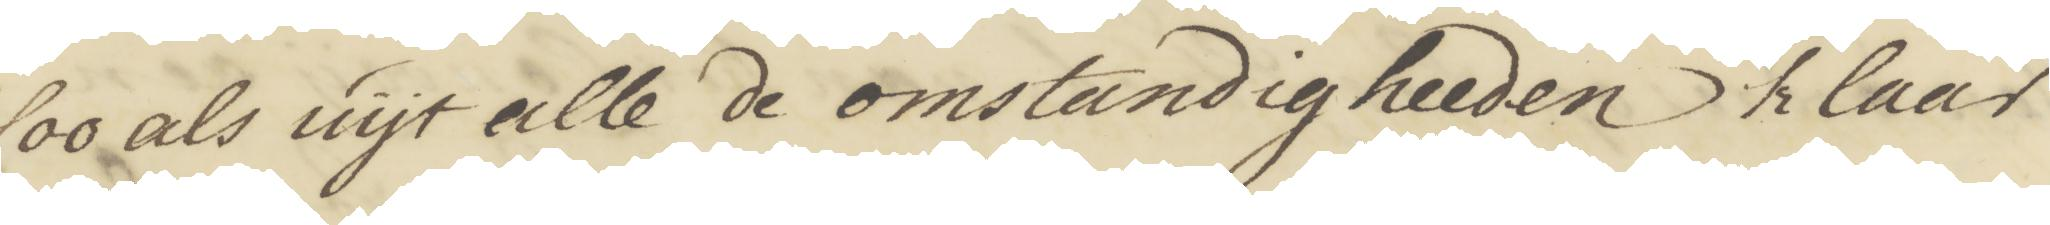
soo als uijt alle de omstandigheeden klaar
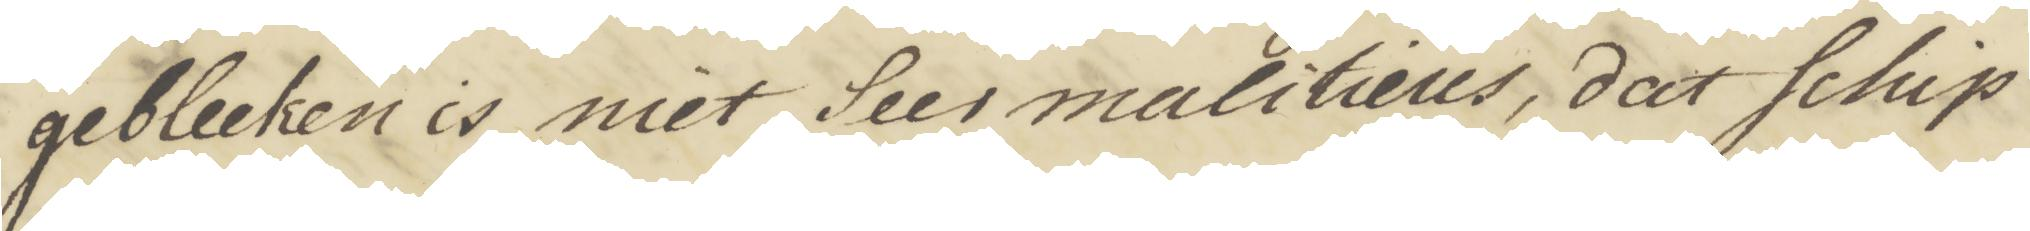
gebleeken is niet seer malitieus, dat schip
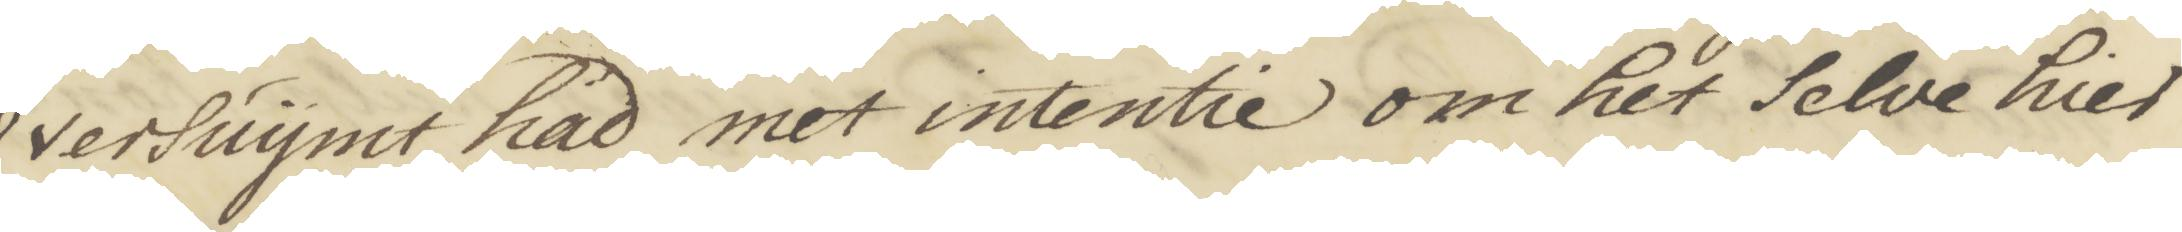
versuijmt had met intentie om het selve hier
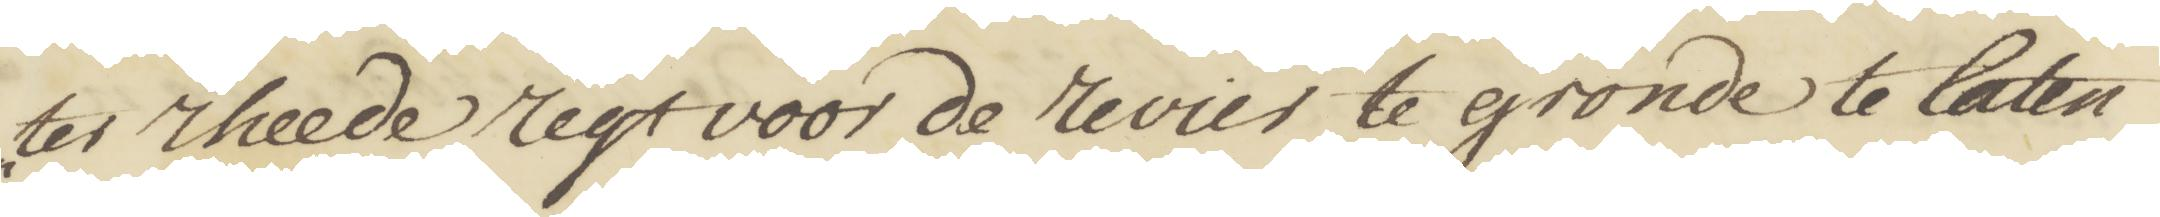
ter rheede regt voor de revier te gronde te laten
